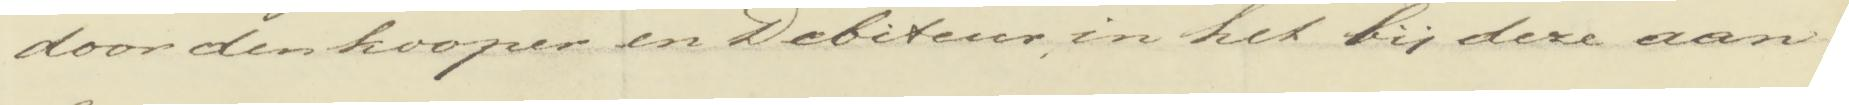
door den kooper en Debiteur in het bij deze aan
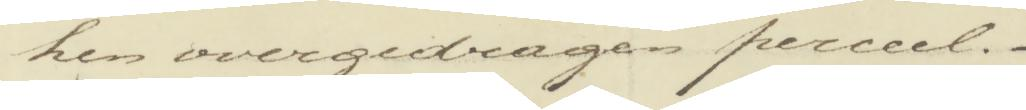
hen overgedragen perceel.
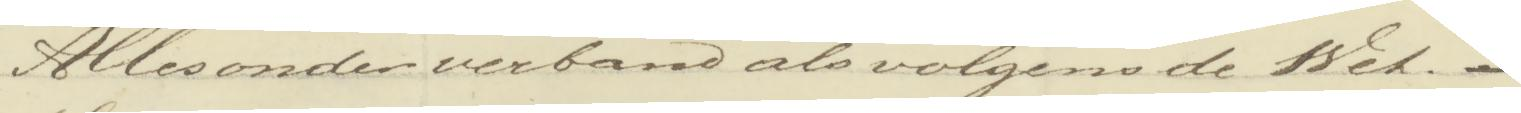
Alles onder verband als volgens de Wet.—
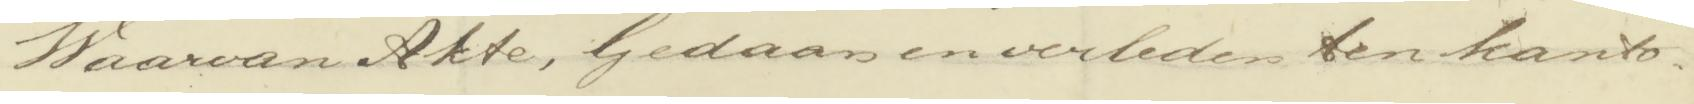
Waarvan Akte, Gedaan en verleden ten kanto„
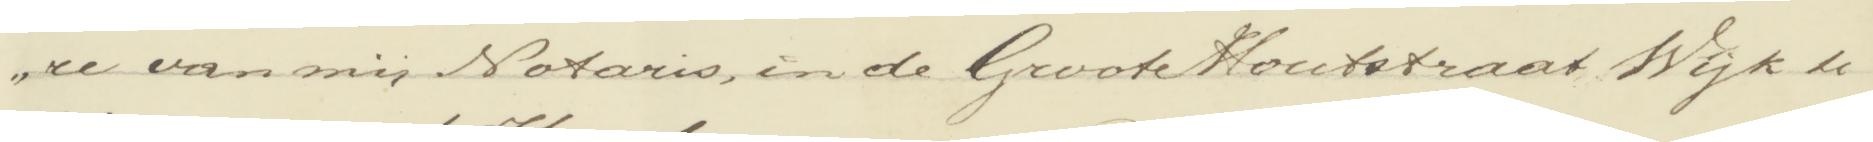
„re van mij Notaris, in de Groote Houtstraat Wijk 4
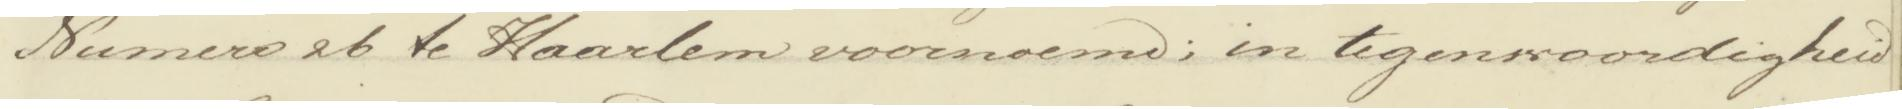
Numero 26 te Haarlem voornoemd; in tegenwoordigheid
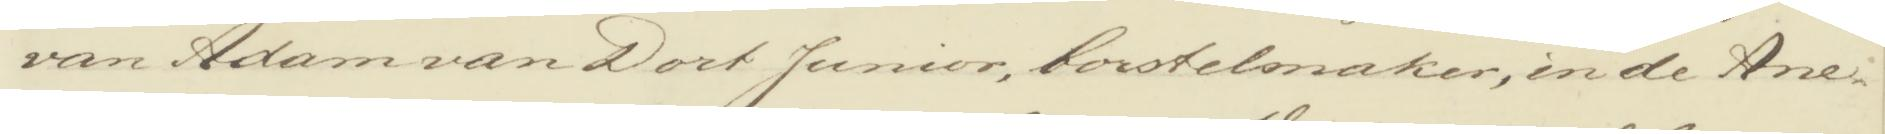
van Adam van Dort Junior, borstelmaker, in de Ane„
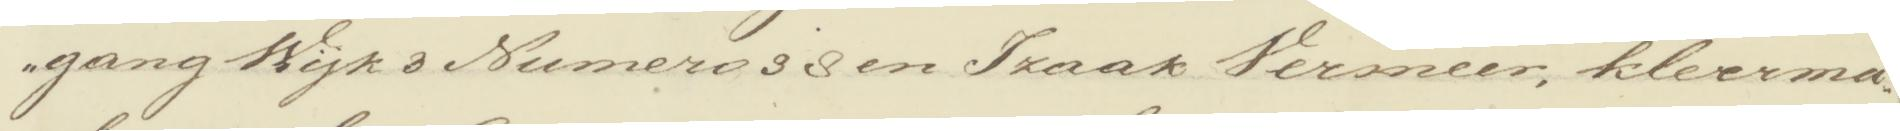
„gang Wijk 3 Numero 38 en Izaak Vermeer, kleerma„
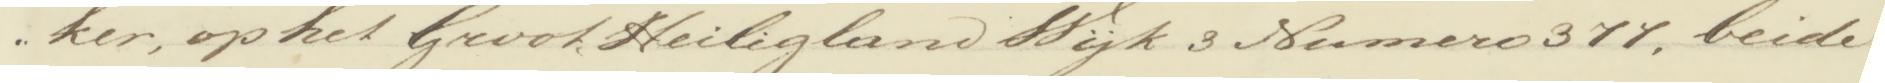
„ker, op het Groot Heiligland Wijk 3 Numero 377, beide
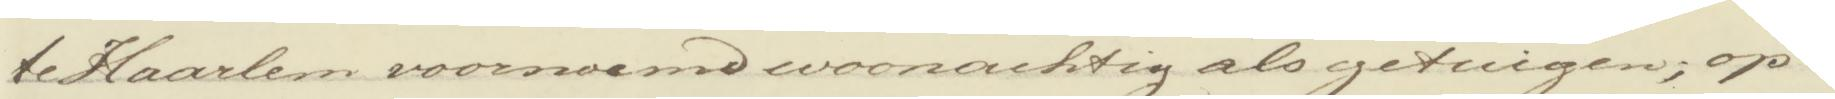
te Haarlem voornoemd woonachtig als getuigen, op
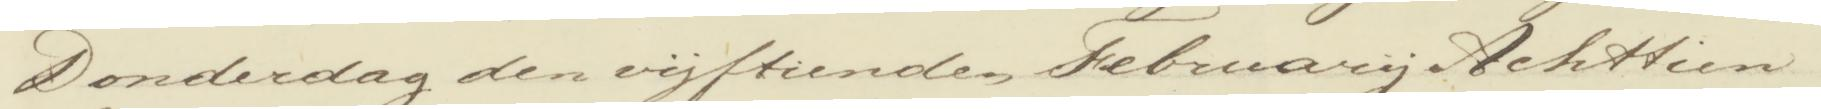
Donderdag den vijftienden Februarij Achttien
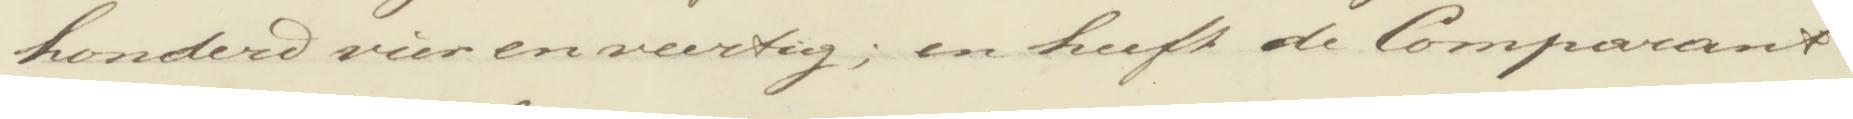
honderd vier en veertig; en heeft de Comparant
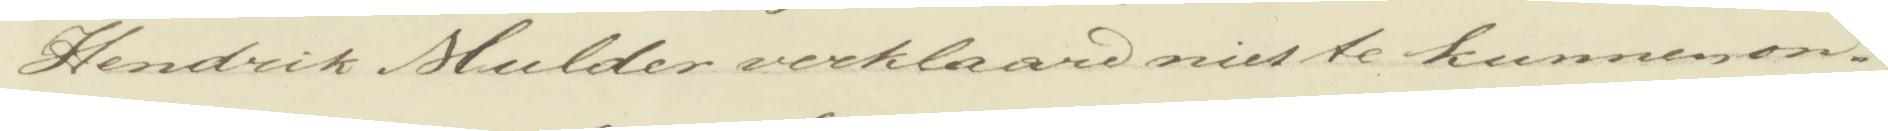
Hendrik Mulder verklaard niet te kunnen on„
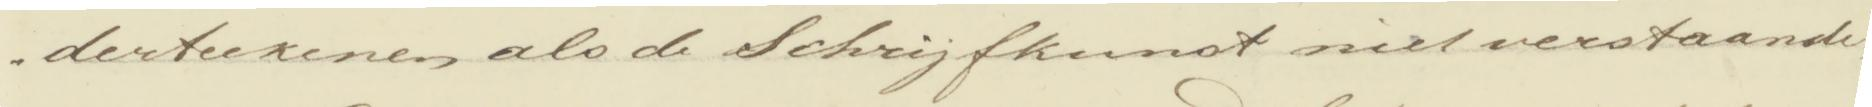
„derteekenen als de Schrijfkunst niet verstaande,
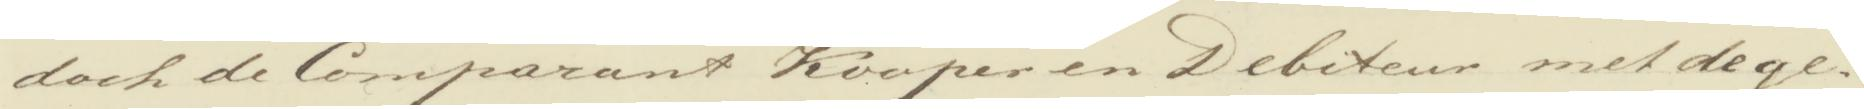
doch de Comparant Kooper en Debiteur met de ge„
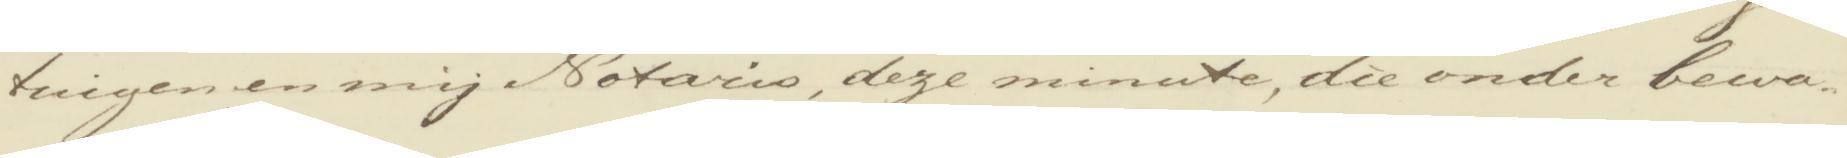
tuigen en mij Notaris, deze minute, die onder bewa„
